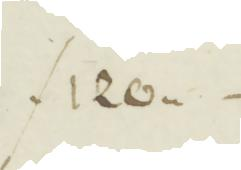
ƒ 120„
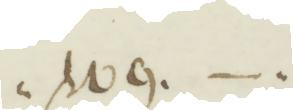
„ 109„ — „
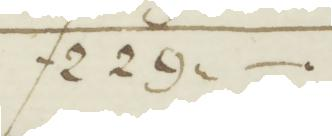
ƒ 229„ —„
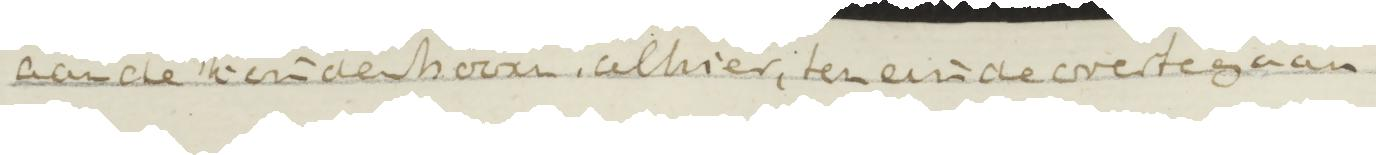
aan de koudenhoorn alhier, ten einde overtegaan
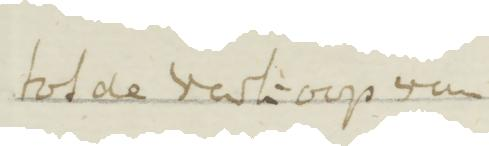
tot de verkoop van
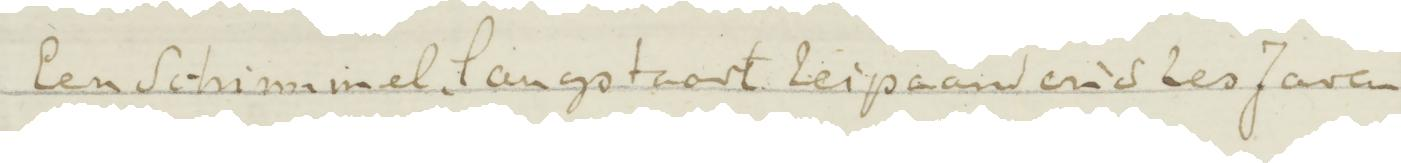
Een Schimmel, Langstaart Reipaard oud Zes Jaren
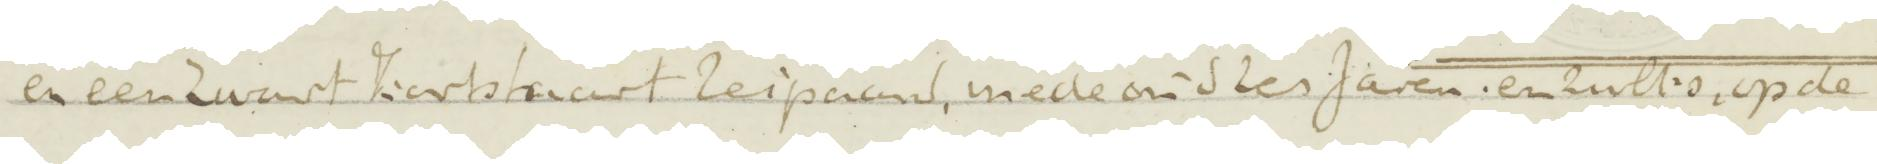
en een Zwart kortstaart Reipaard, mede oud zes Jaren. en zulks, op de
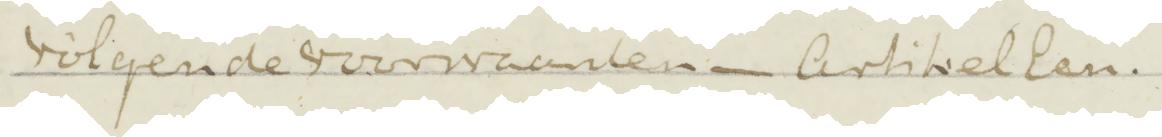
volgende voorwaarden — Artikel Een
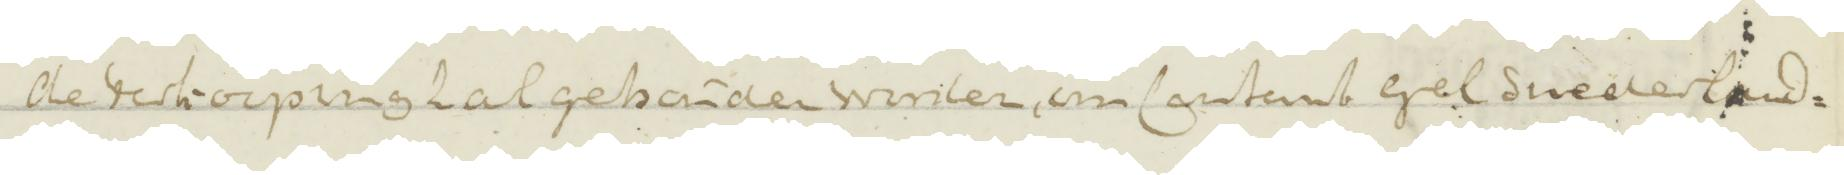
de verkooping zal gehouden worden, om Contant geld nederland=
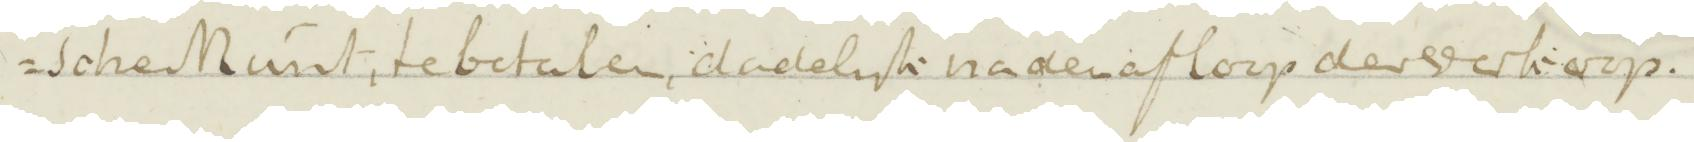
=sche Munt, te betalen, dadelyk na den afloop der verkoop.
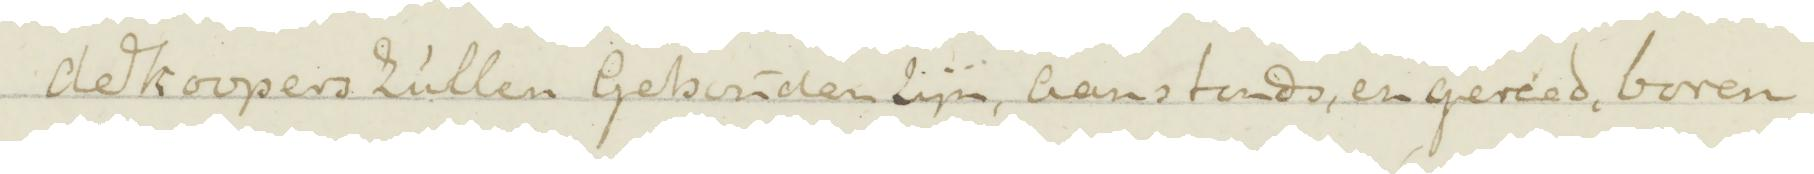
de koopers zullen gehouden zijn, aanstonds, en gereed, boven
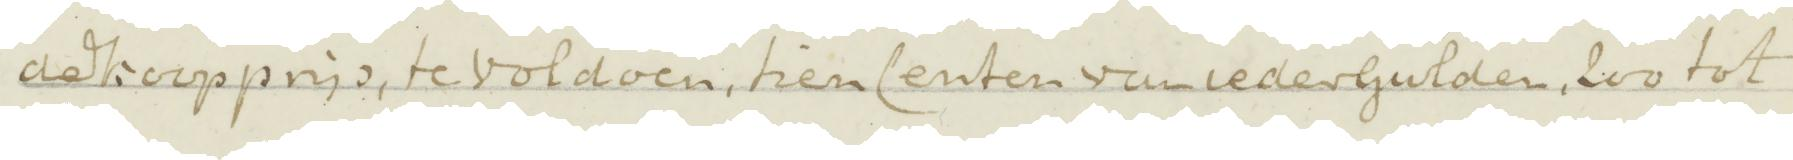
de koopprijs, te voldoen, tien centen van ieder gulden, zoo tot
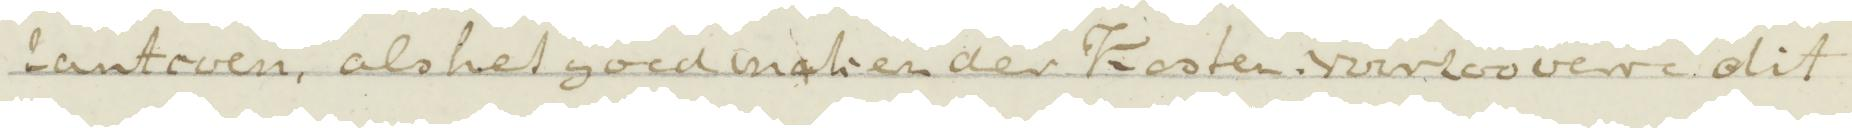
rantcoen, als het goedmaken der Kosten. voor zooverre dit
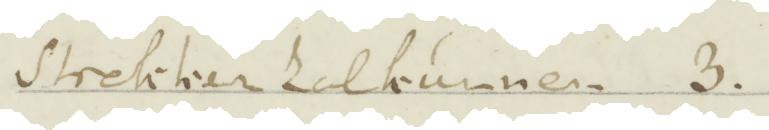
strekken zal kunnen 3.
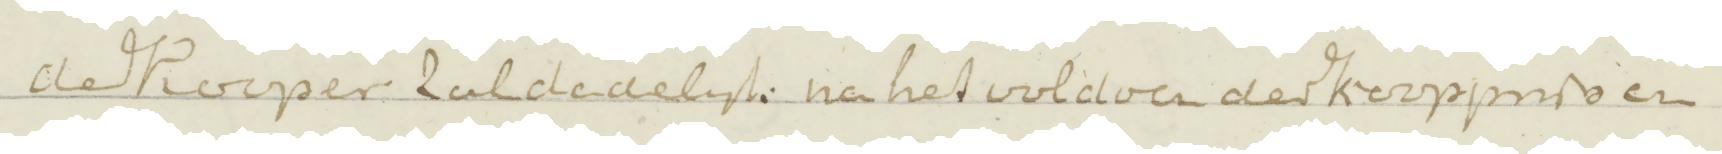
de Kooper zal dadelyk na het voldoen der koopprys en
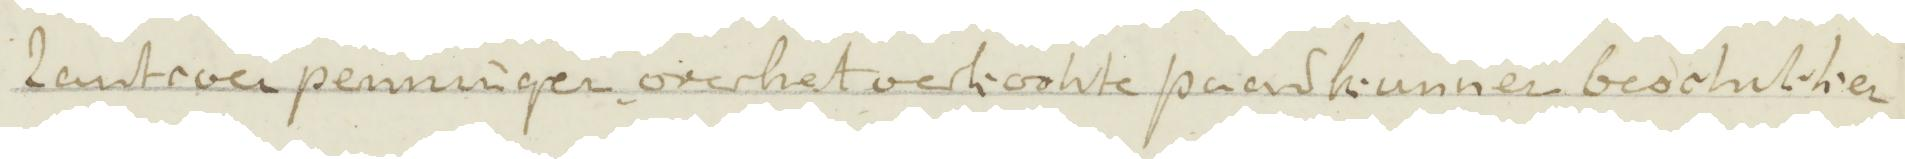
Rantcoen penningen over het verkochte paard kunnen beschikken
